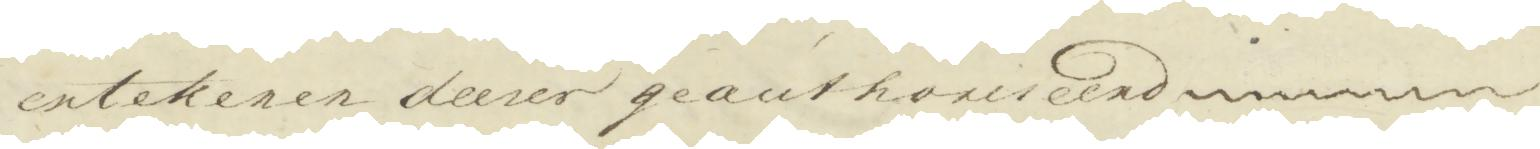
en tekenen deeser geauthoriseerd —
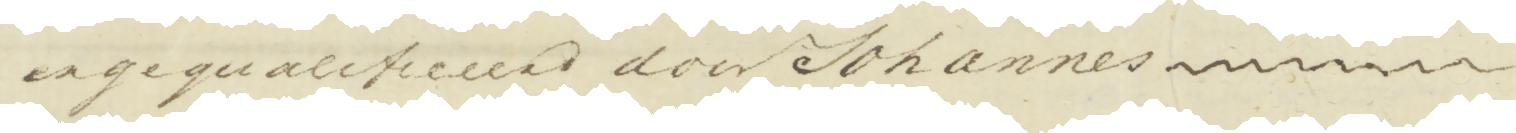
en gequalificeerd door Iohannes —
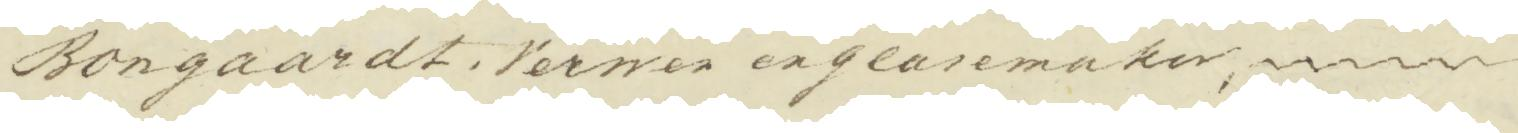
Bongaardt, Verwer en glasemaker, —
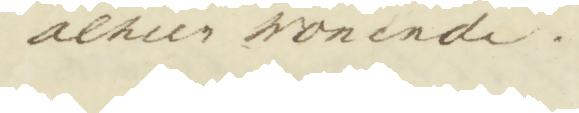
alhier wonende.
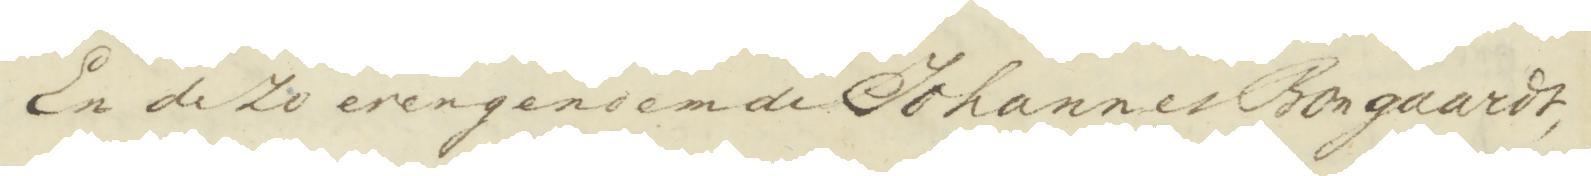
En de zo even genoemde Iohannes Bongaardt,
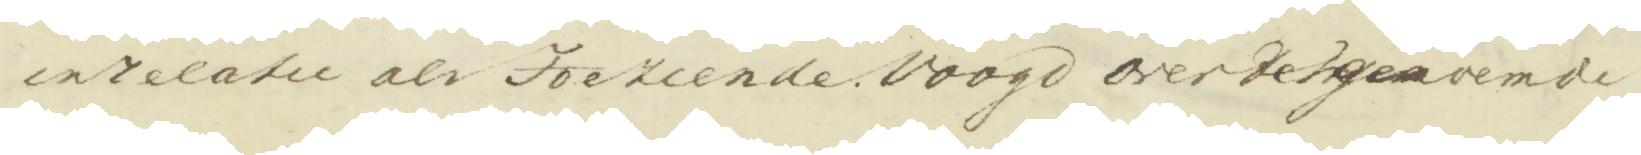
in relatie als Toeziende voogd over den genoemde
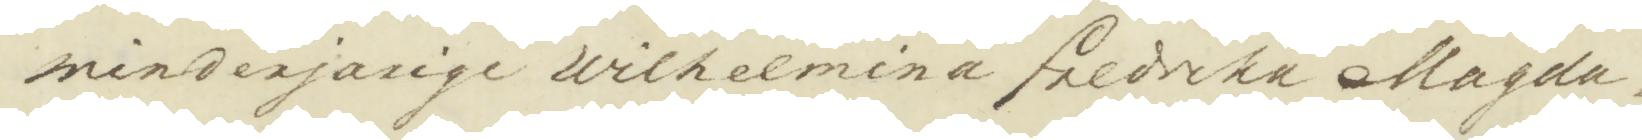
minderjarige wilhelmina fredrika Magda
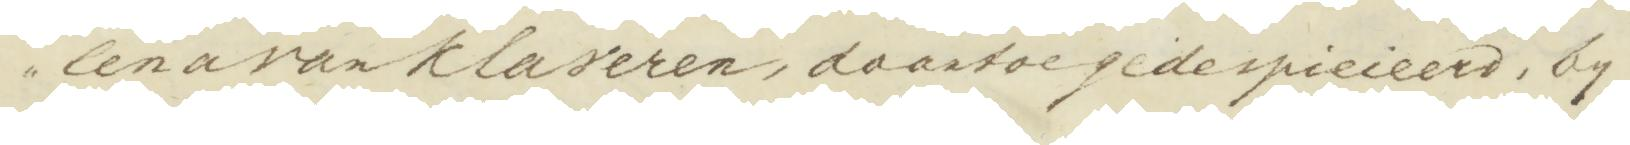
„lena van klaveren, daartoe gedespicieerd, by
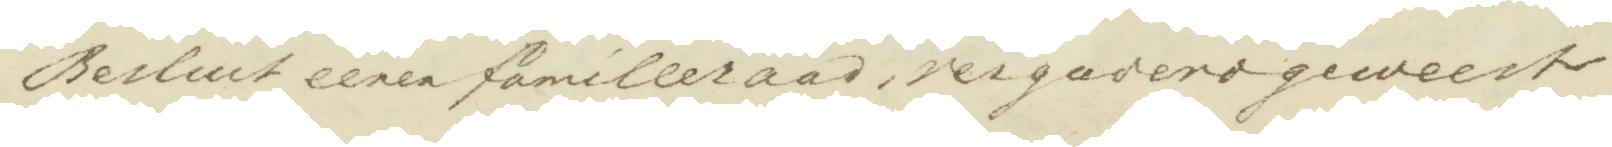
Besluit eener familleraad, vergaderd geweest
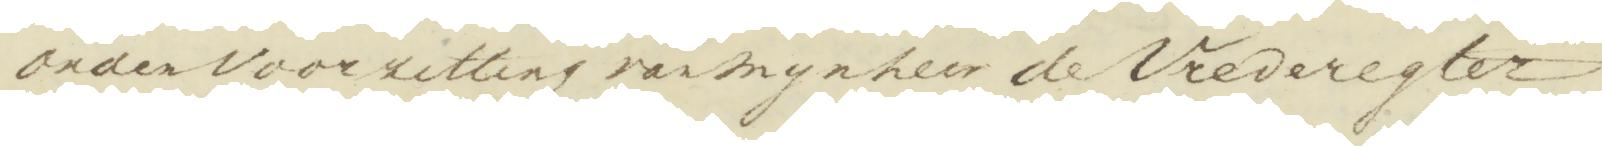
onder voorzitting van myn heer de Vrederegter
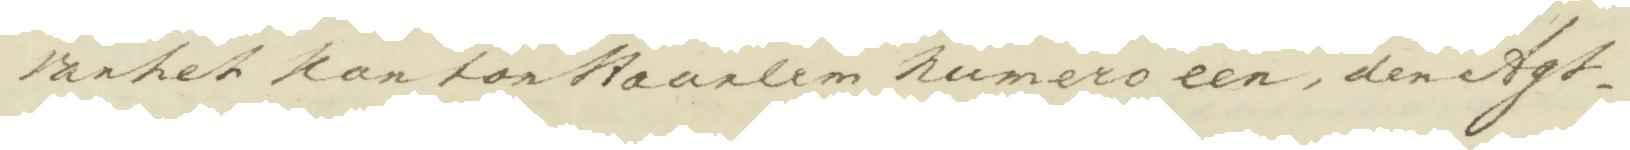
van het kanton Haarlem Numero een, den Agt-
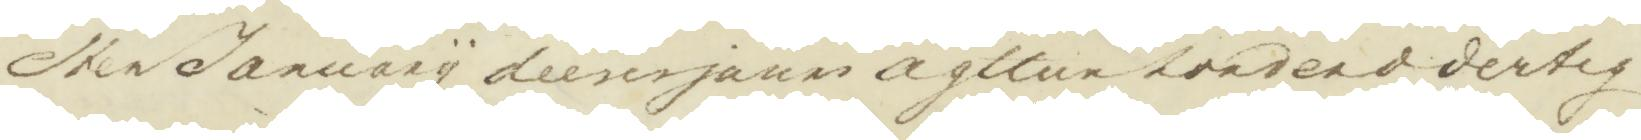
sten Ianuarij deeses jaars agttien honderd dertig
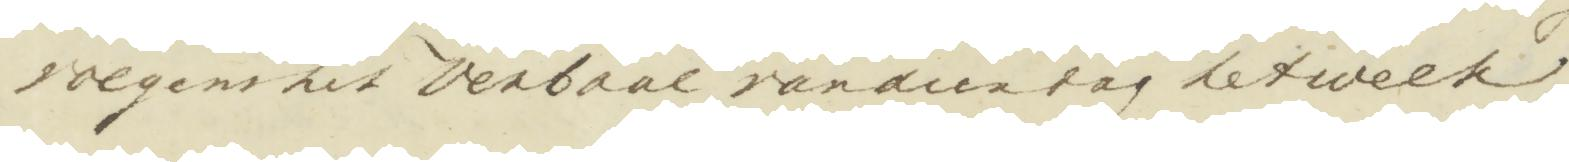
volgens het verbaal van dien dag hetwelk
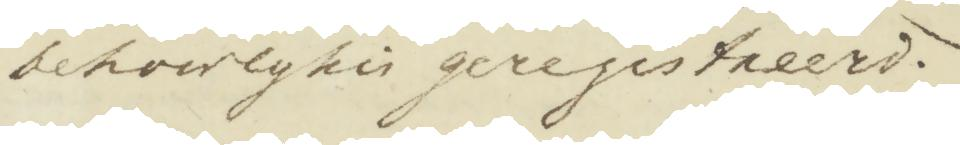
behoorlyk is geregistreerd.
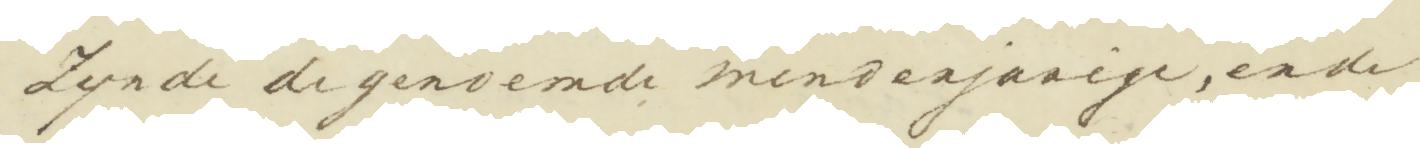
Zynde de genoemde minderjarige, ende
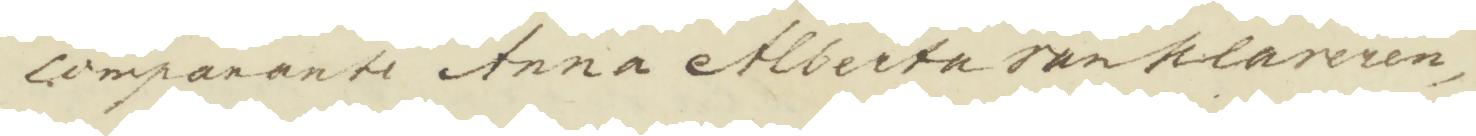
comparante Anna Alberta van klaveren,
